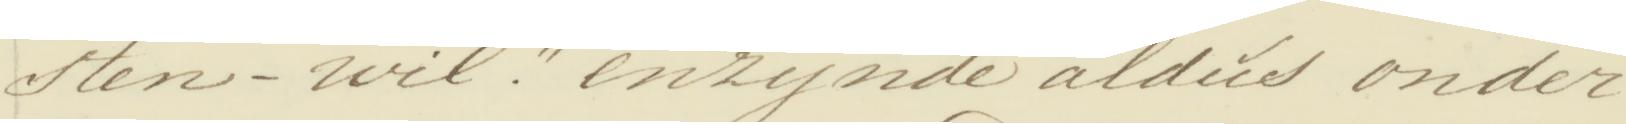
sten-wil." en zijnde aldus onder-
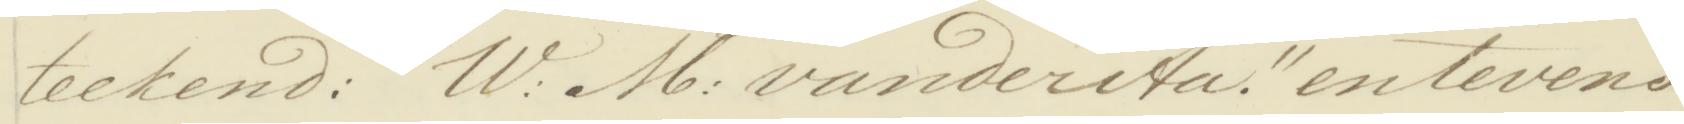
teekend: W: M: vander Aa: en tevens
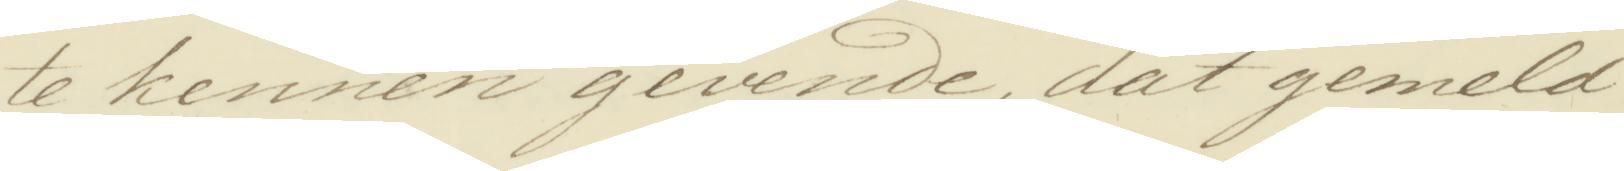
te kennen gevende, dat gemeld
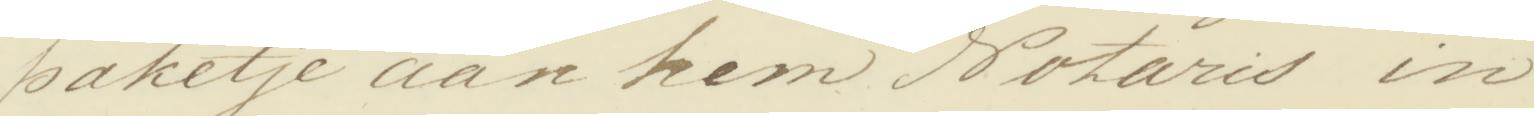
paketje aan hem Notaris in
